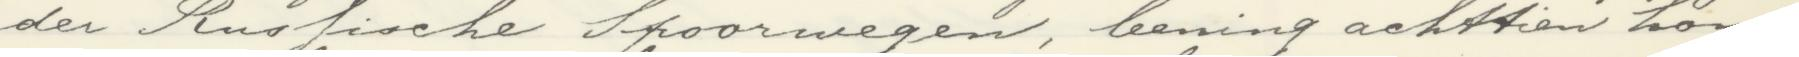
der Russische Spoorwegen, lening achttien hon
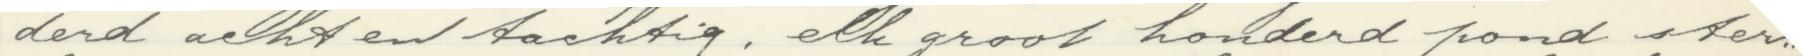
derd acht en tachtig, elk groot honderd pond ster„
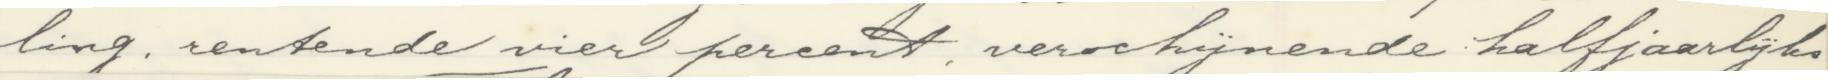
ling, rentende vier percent, verschijnende halfjaarlijks
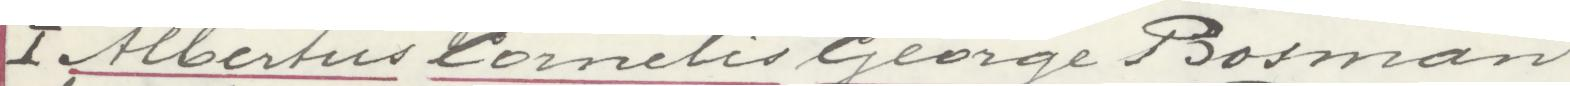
I Albertus Cornelis George Bosman
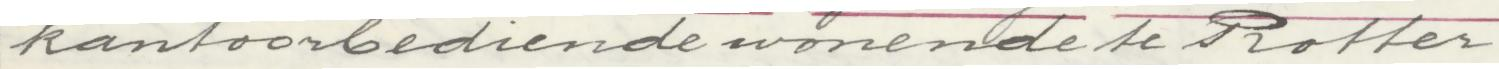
kantoorbediende wonende te Rotter
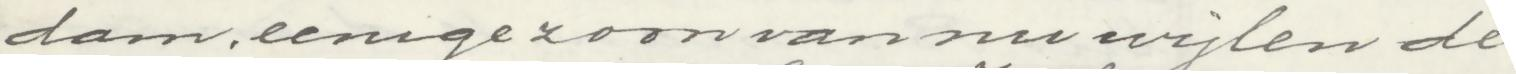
dam, eenige zoon van nu wijlen de
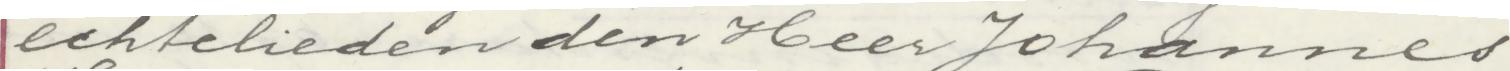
echtelieden den Heer Johannes
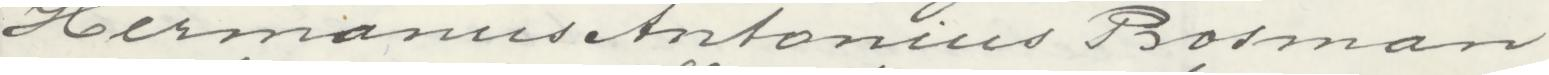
Hermanus Antonius Bosman
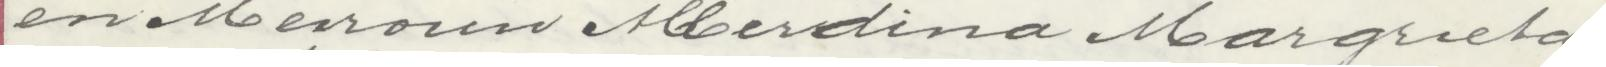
en Mevrouw Alberdina Margrieta
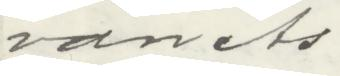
van As
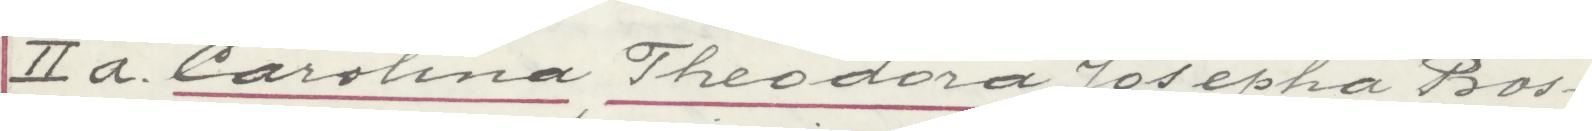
II a. Carolina Theodora Josepha Bos-
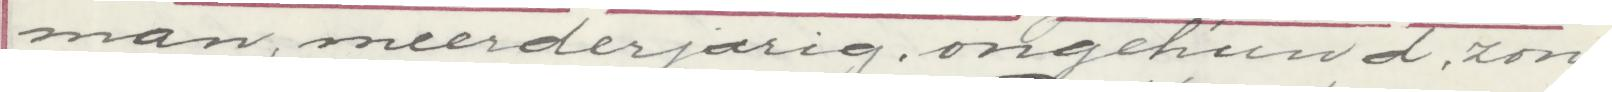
man, meerderjarig, ongehuwd, zon
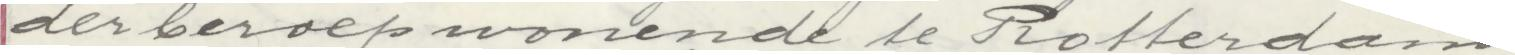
der beroep wonende te Rotterdam
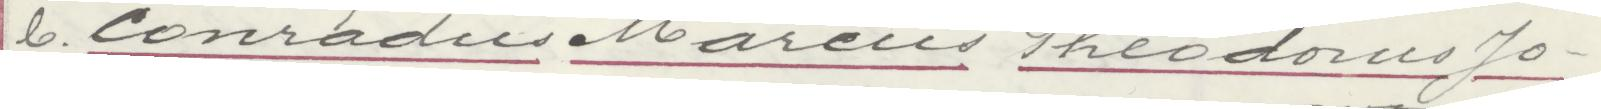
b. Conradus Marcus Theodorus Jo-
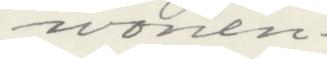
wonen
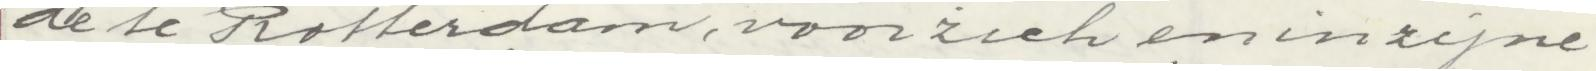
de te Rotterdam, voor zich en in zijne
